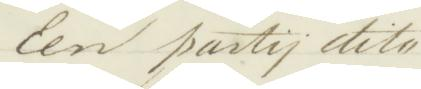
Een partij dito
